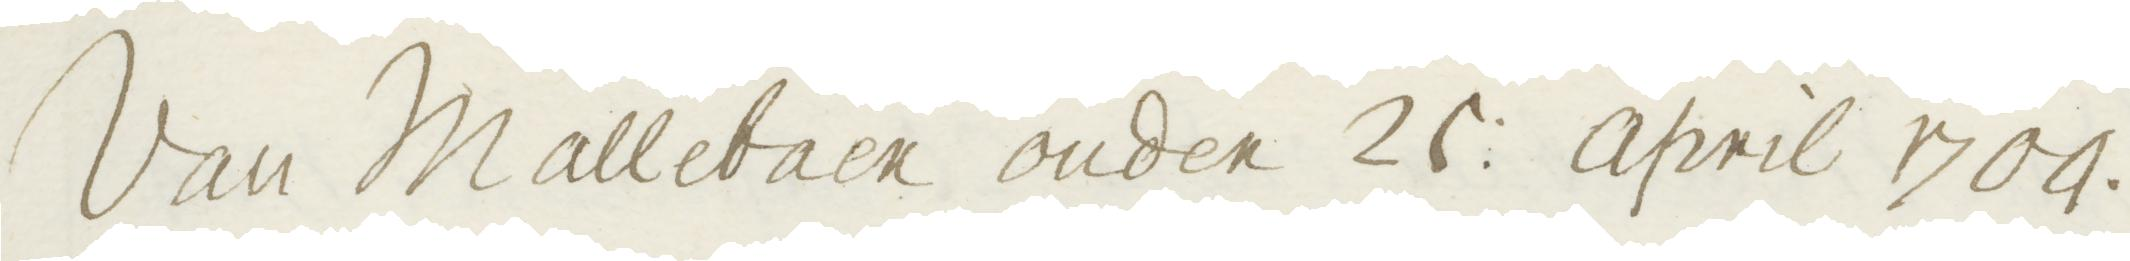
Van Mallebaer onder 25: april 1704.
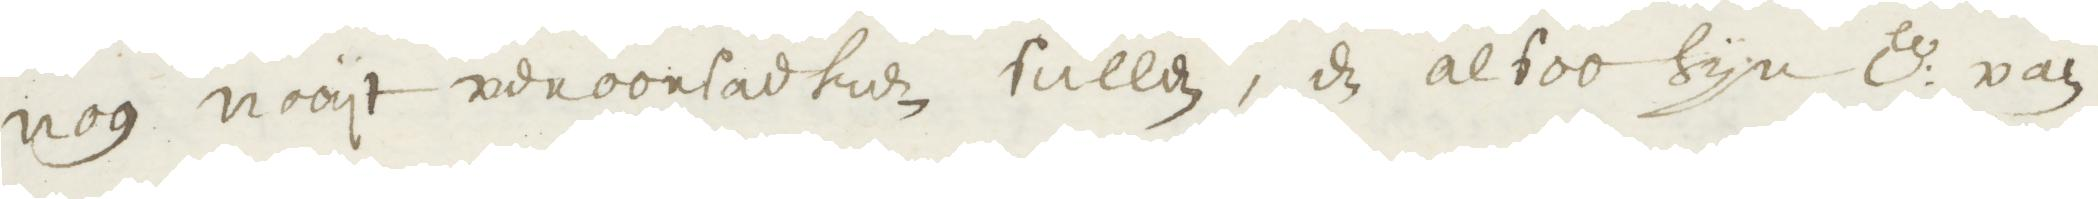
nog nooijt veroorsaeken sullen, en alsoo sijn E: van
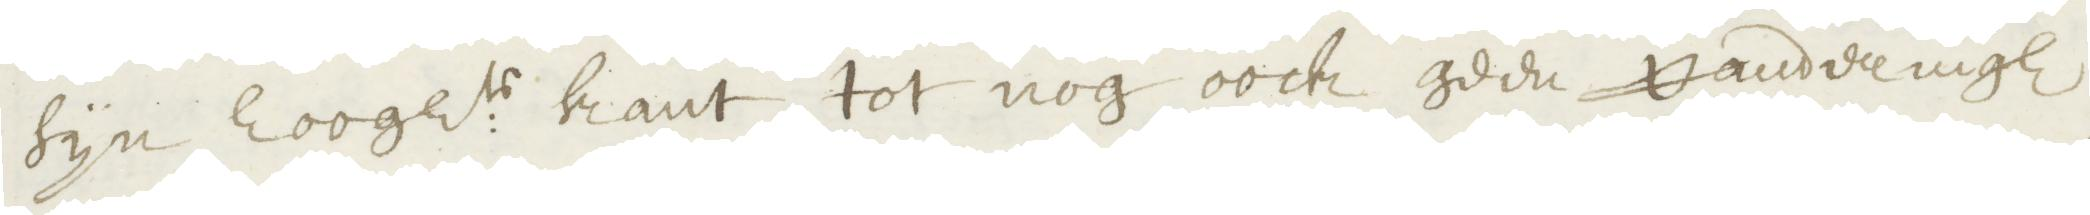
sijn hoogh:ts kant tot nog oock geen veranderingh
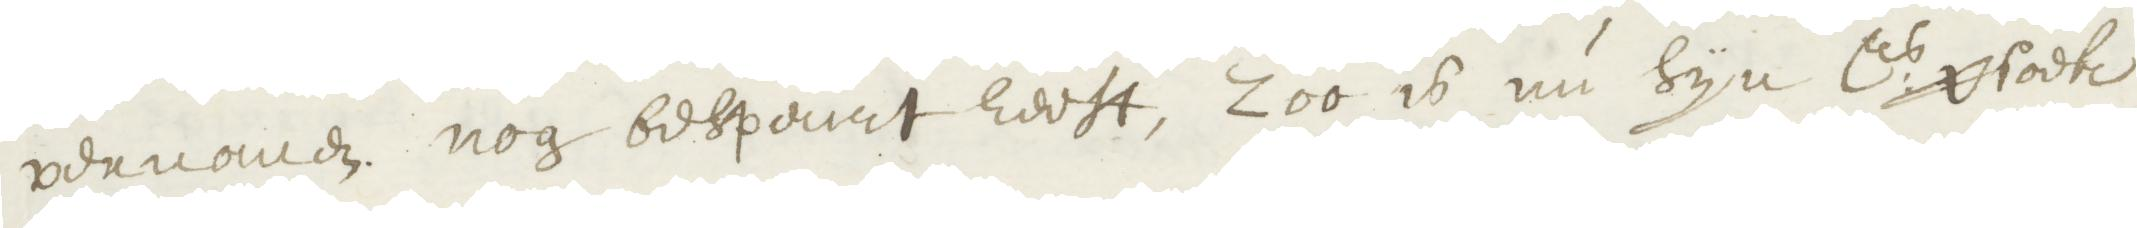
vernamen. nog bespeurt heeft, zoo is nu sijn E:s versoek
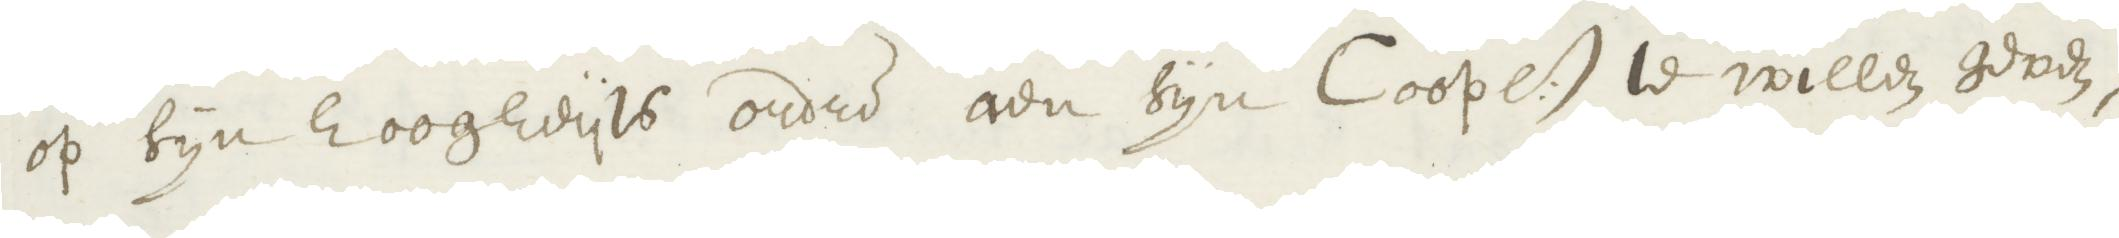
op sijn hoogheijts ordre aen sijn Coopl: te willen geven,
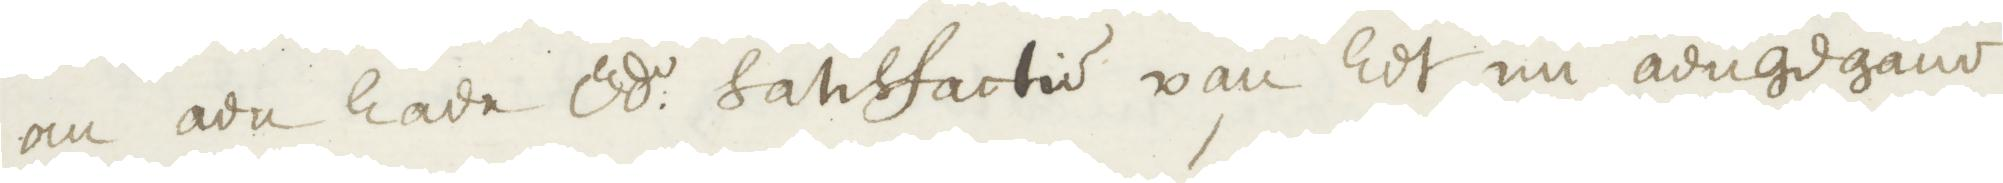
om aen haer Ed:e satisfactie van het nu aengegane
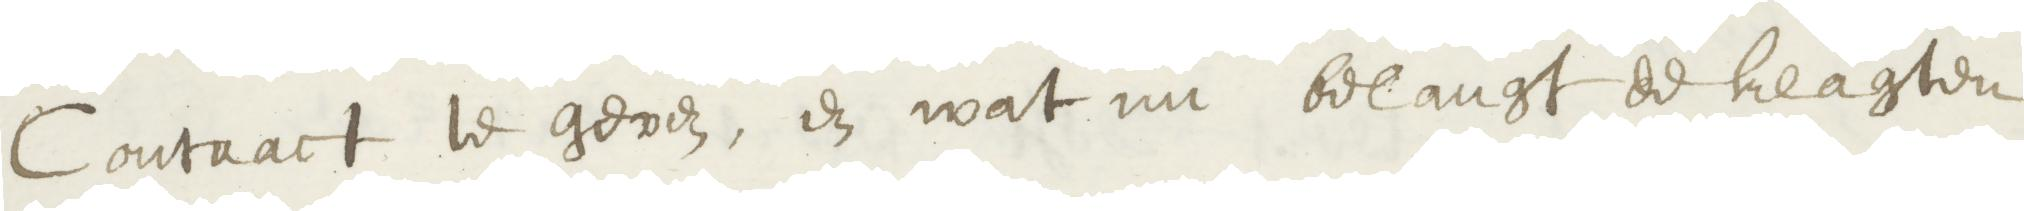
Contract te geven, en wat nu belangt de klagten
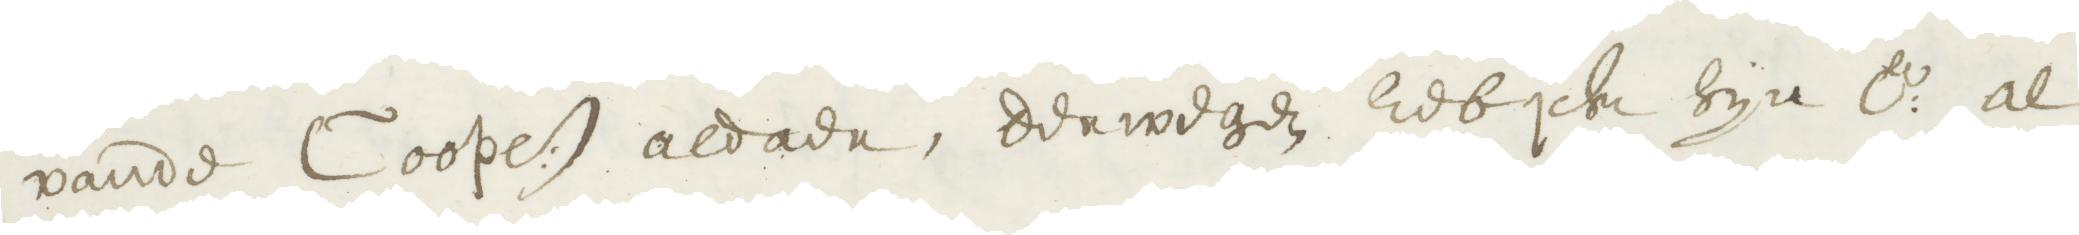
vande Coopl: aldaer, derwegen heb jck sijn E: al
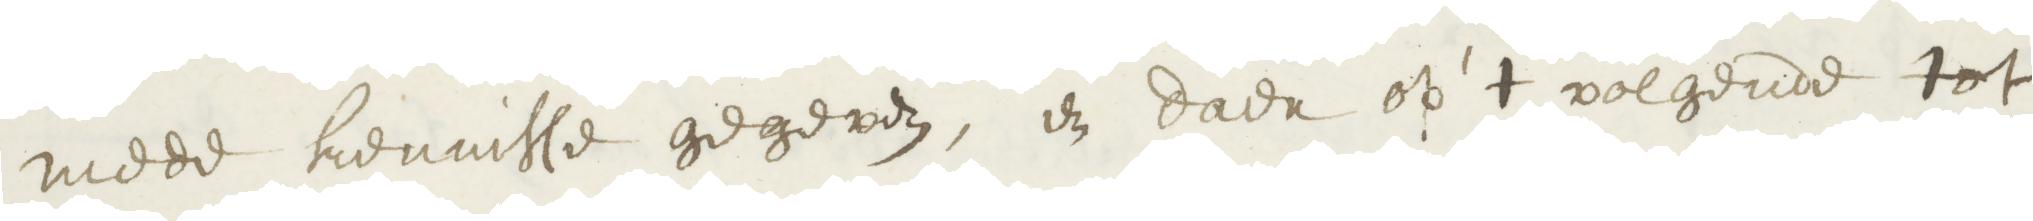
mede kennisse gegeven, en daer op ’t volgende tot
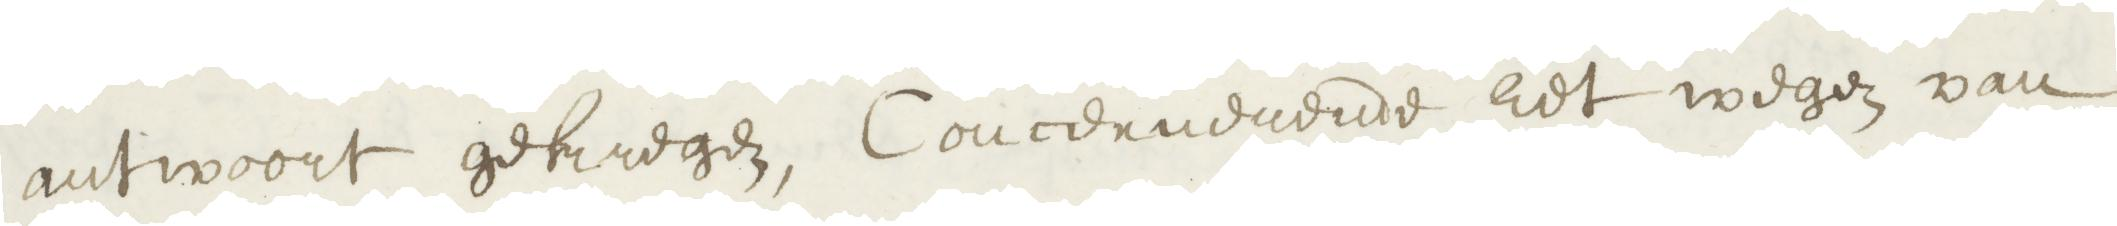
antwoort gekregen, Concernerende het wegen van
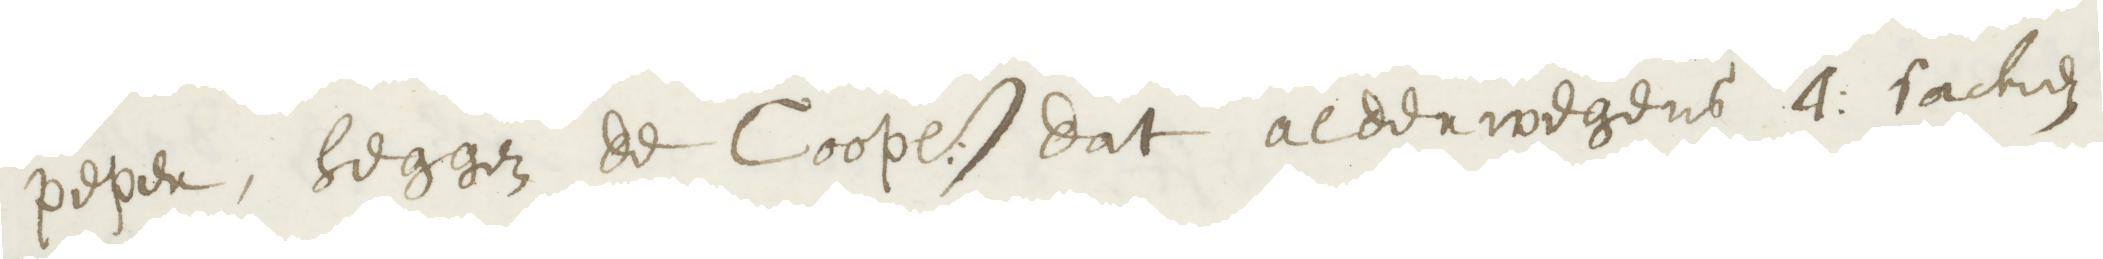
peper, seggen de Coopl: dat alderwegens 4: sacken
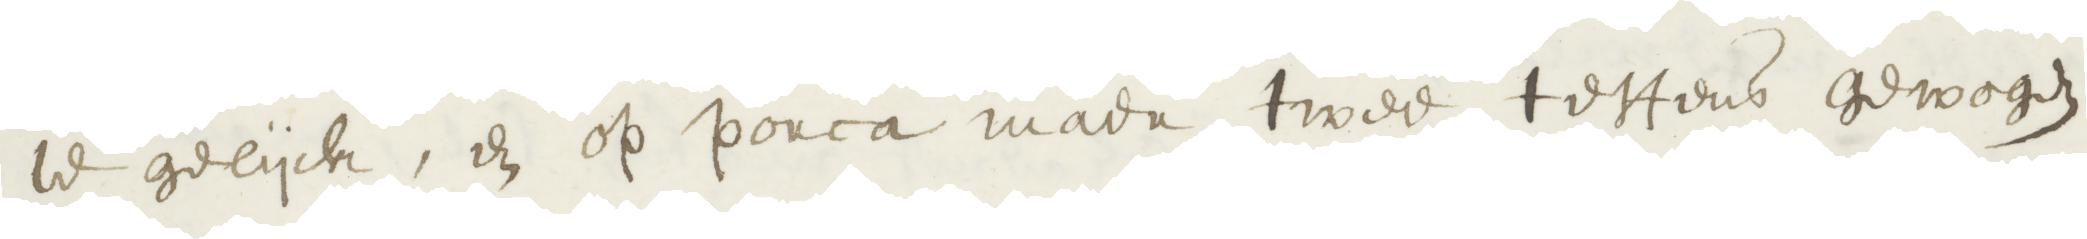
te gelijck, en op porca maer twee teffens gewogen
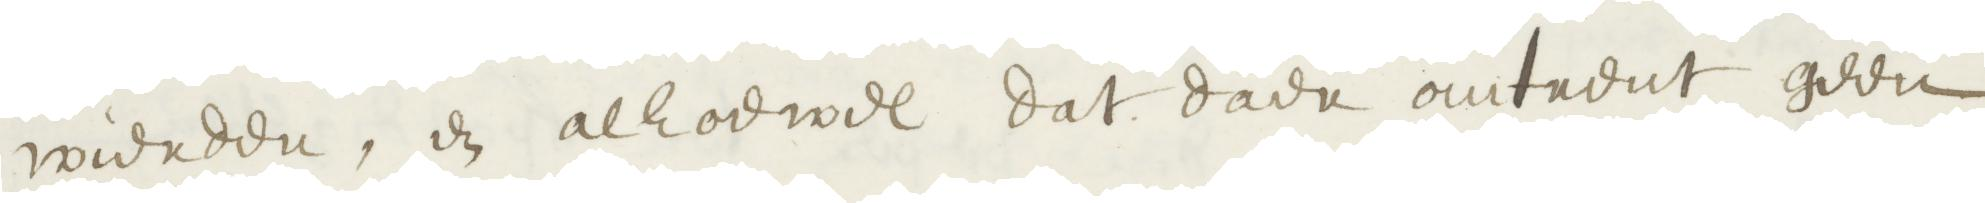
wierden, en alhoewel dat daer omtrent geen
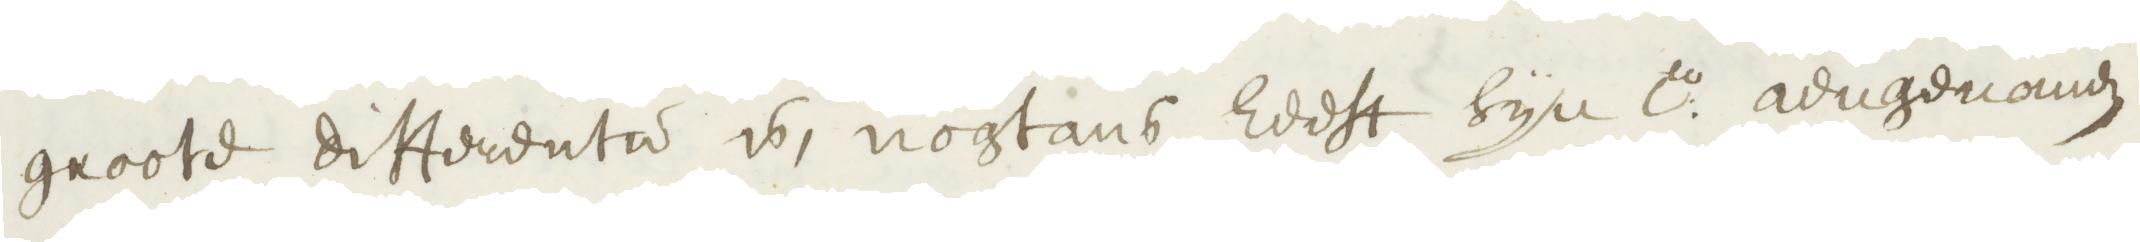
groote differentie is, nogtans heeft sijn E: aengenomen
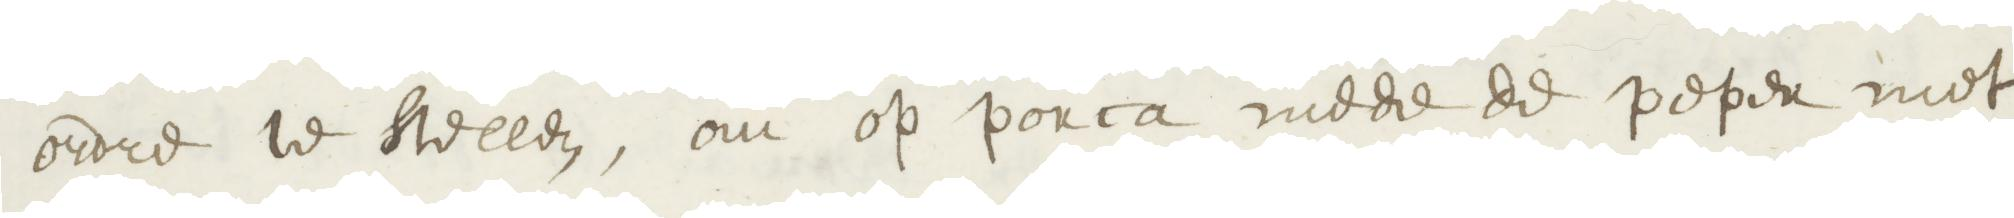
ordre te stellen, om op porca mede de peper met
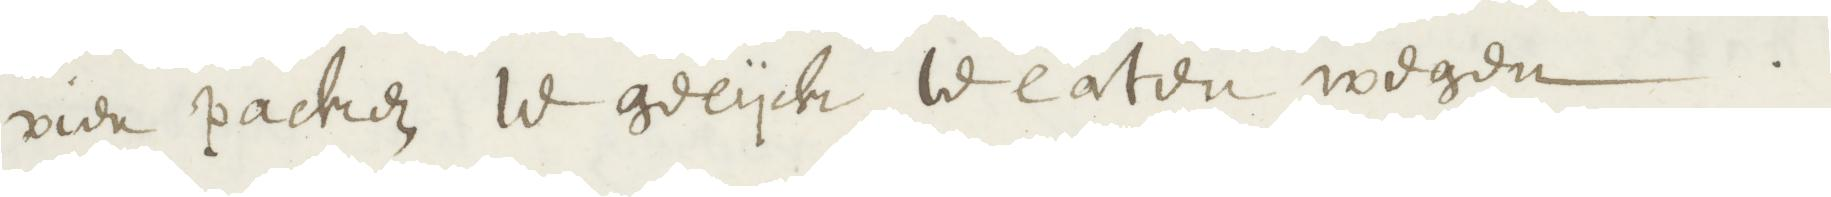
vier packen te gelijk te laten wegen.
